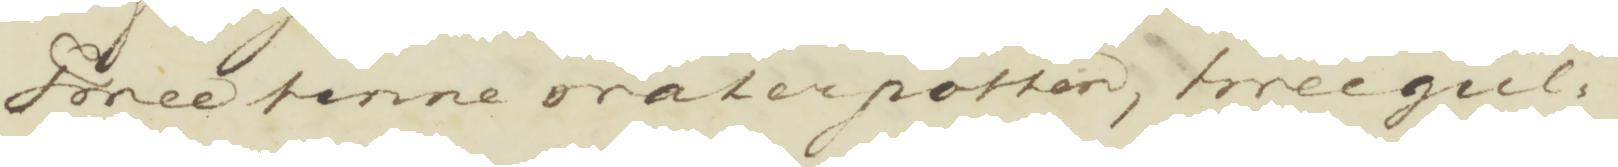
Twee tinne waterpotten, twee gul:
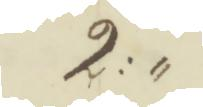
2:„
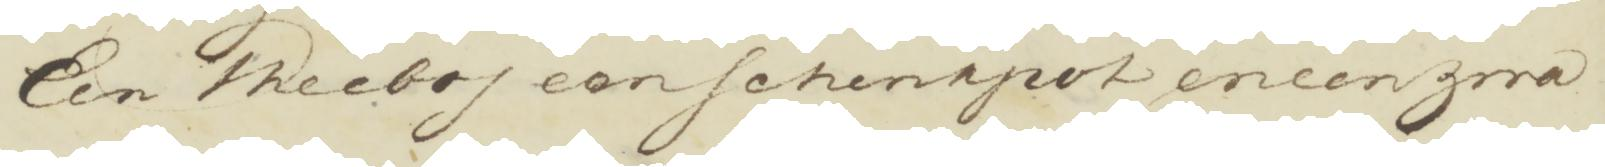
Een theebos een schenkpot en een zwa
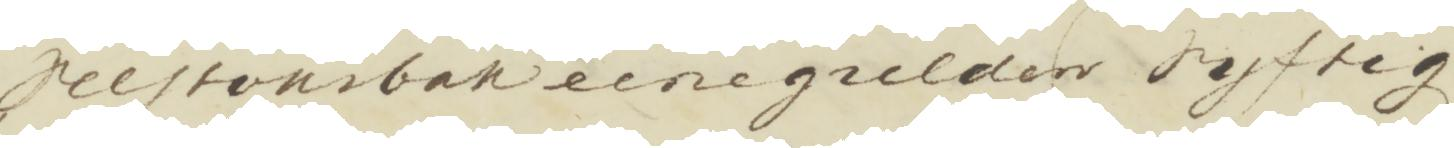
velstoksbak eene gulden vyftig
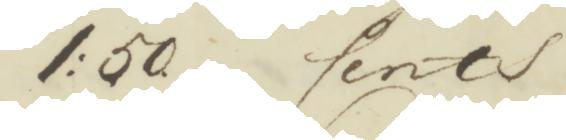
1:50. Cents
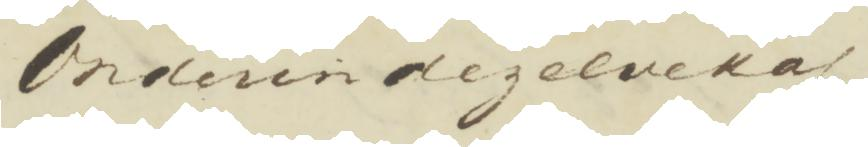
Onderin dezelve kas
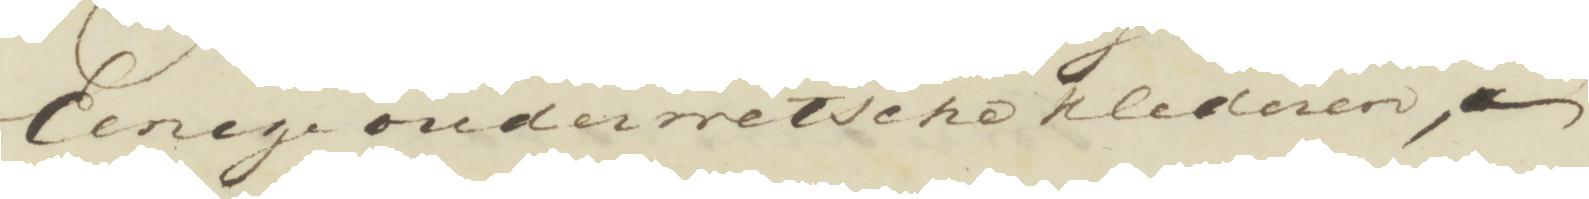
Eenige ouderwetsche klederen, a
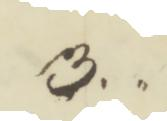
3.„
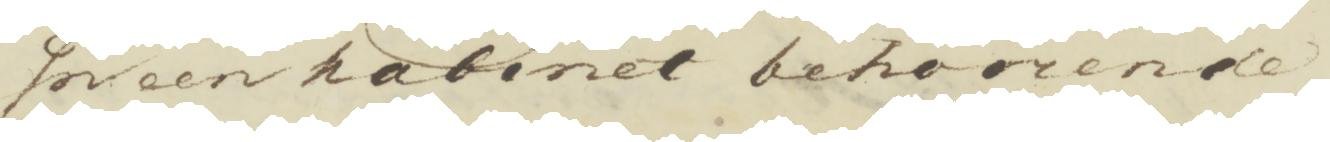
Jn een kabinet behoorende
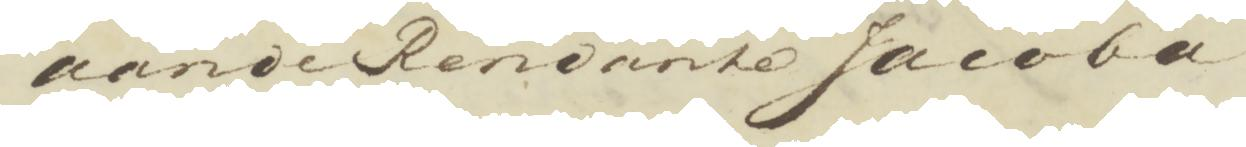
aan de Rendante Jacoba
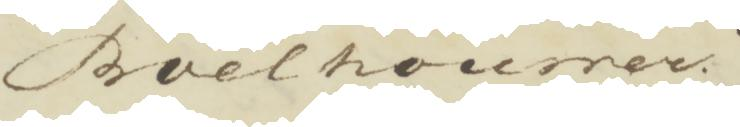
Boelhouwer.
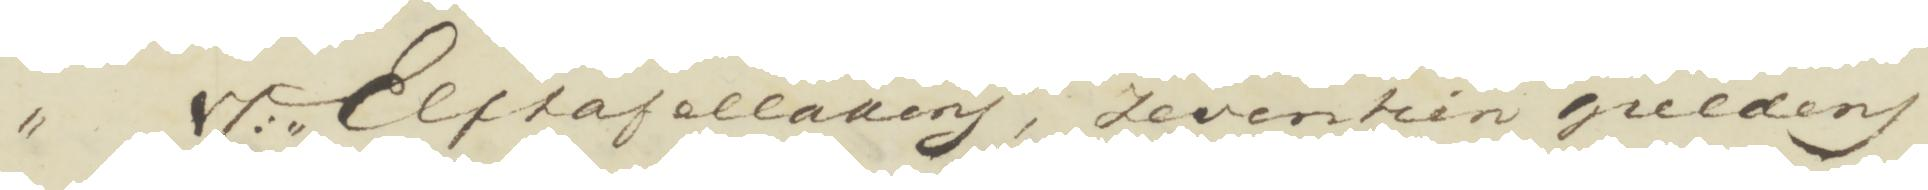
„ 17:„ Eettafellaken, zeventien guldens
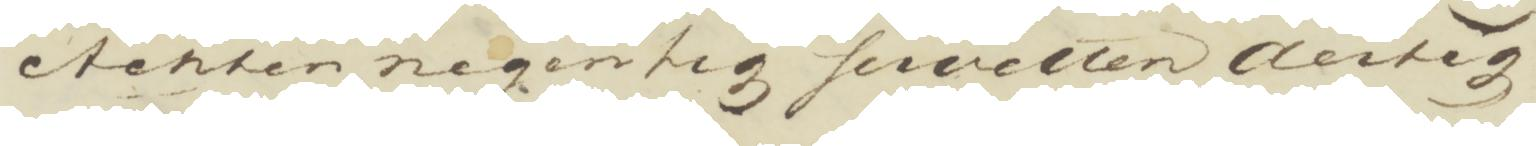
Achten negentig servetten dertig
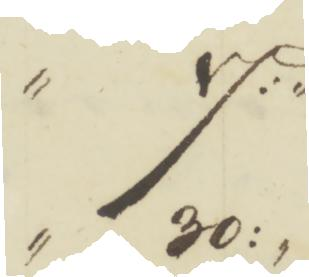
„ 30:„
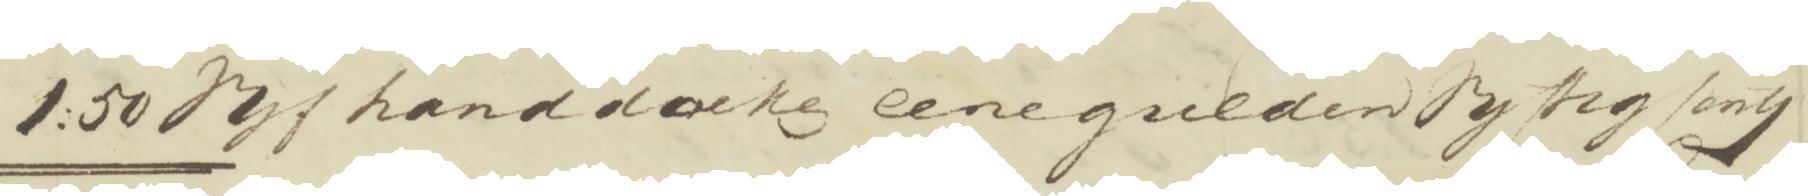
1:50 Vyf handdoeke eene gulden Vyftig Cents
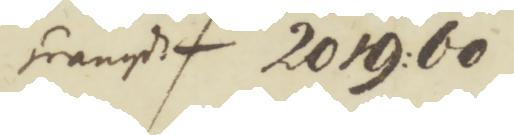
Transp.t ƒ 2019:60
